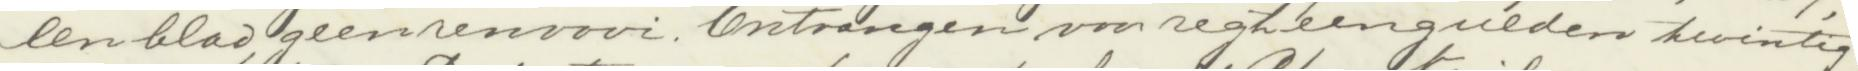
een blad geen renvooi. Ontvangen voor regt een gulden twintig
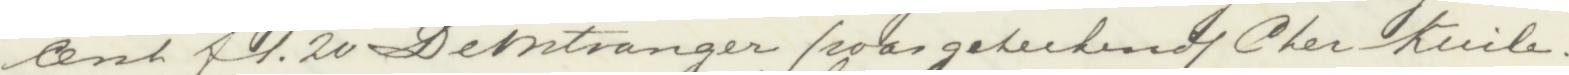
Cent ƒ 1.20 De ontvanger /was geteekend/ C ter Kuile.
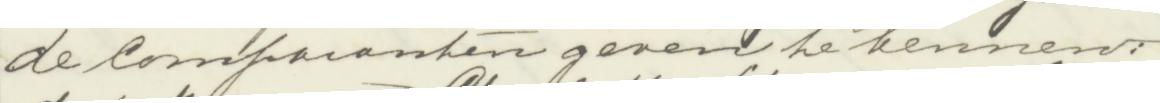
de Comparanten geven te kennen:
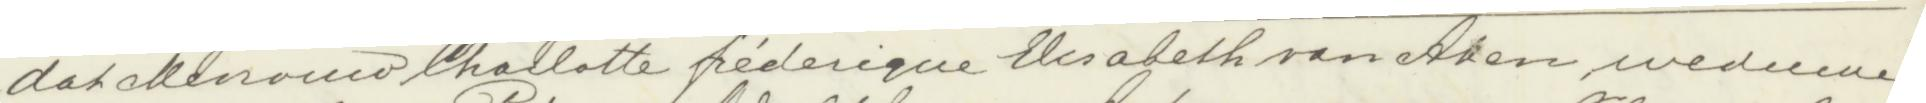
dat Mevrouw Charlotte fréderique Elisabeth van Aken, weduwe
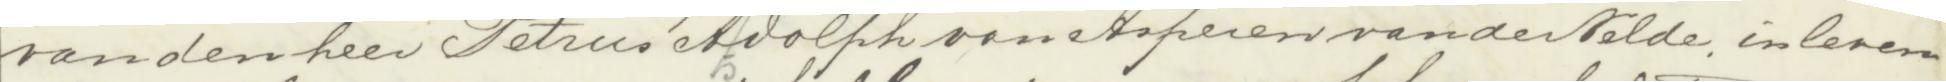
van den heer Petrus Adolph van Asperen van der Velde, in leven
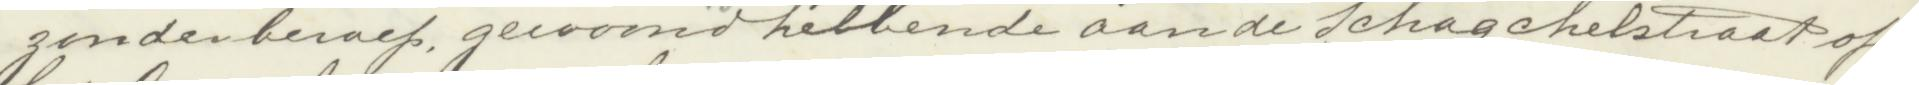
zonder beroep, gewoond hebbende aan de Schagchelstraat op
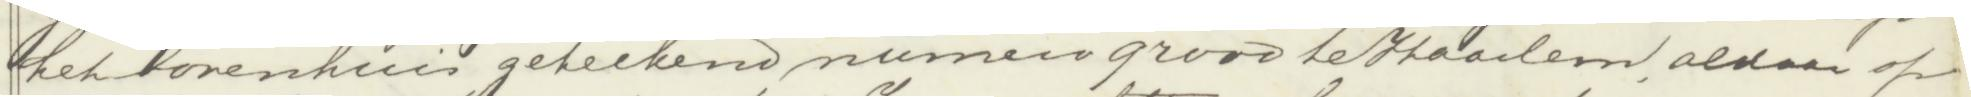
het bovenhuis geteekend numero 9 rood te Haarlem, aldaar op
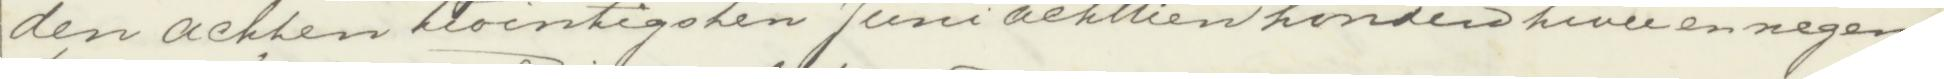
den achten twintigsten Juni achttien honderd twee en negen
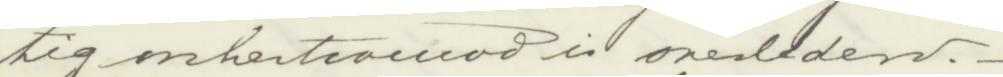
tig onhertrouwd is overleden.-
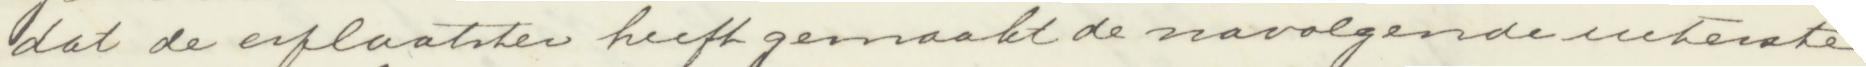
dat de erflaatster heeft gemaakt de navolgende uiterste
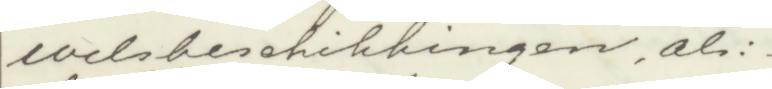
wilsbeschikkingen, als:
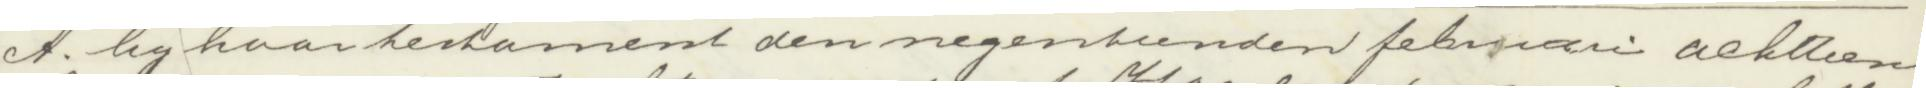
A. by haar testament den negentienden febuari achttien
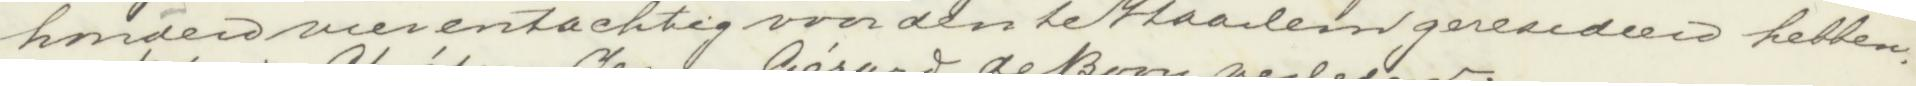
honderd vier entachtig voor den te Haarlem geresideerd hebben,
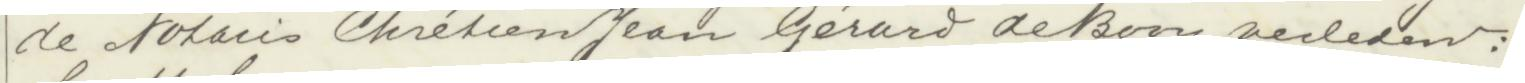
de Notaris Chrétien Jean Gérard de Booy verleden:
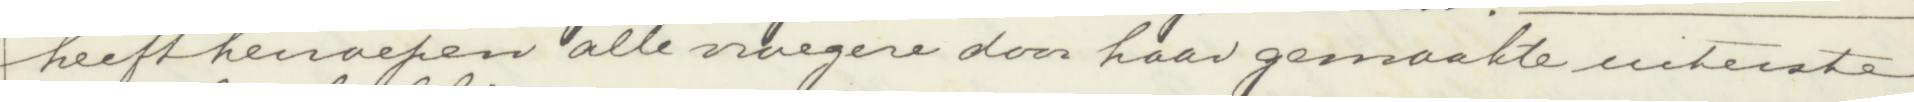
heeft herroepen alle vroegere door haar gemaakte uiterste
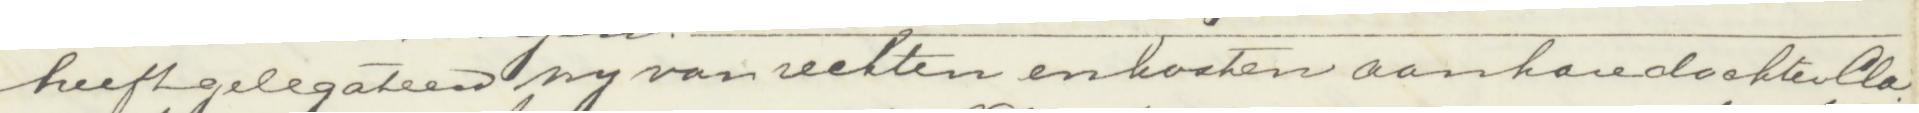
heeft gelegateerd vry van rechten en kosten aan hare dochter Cla
